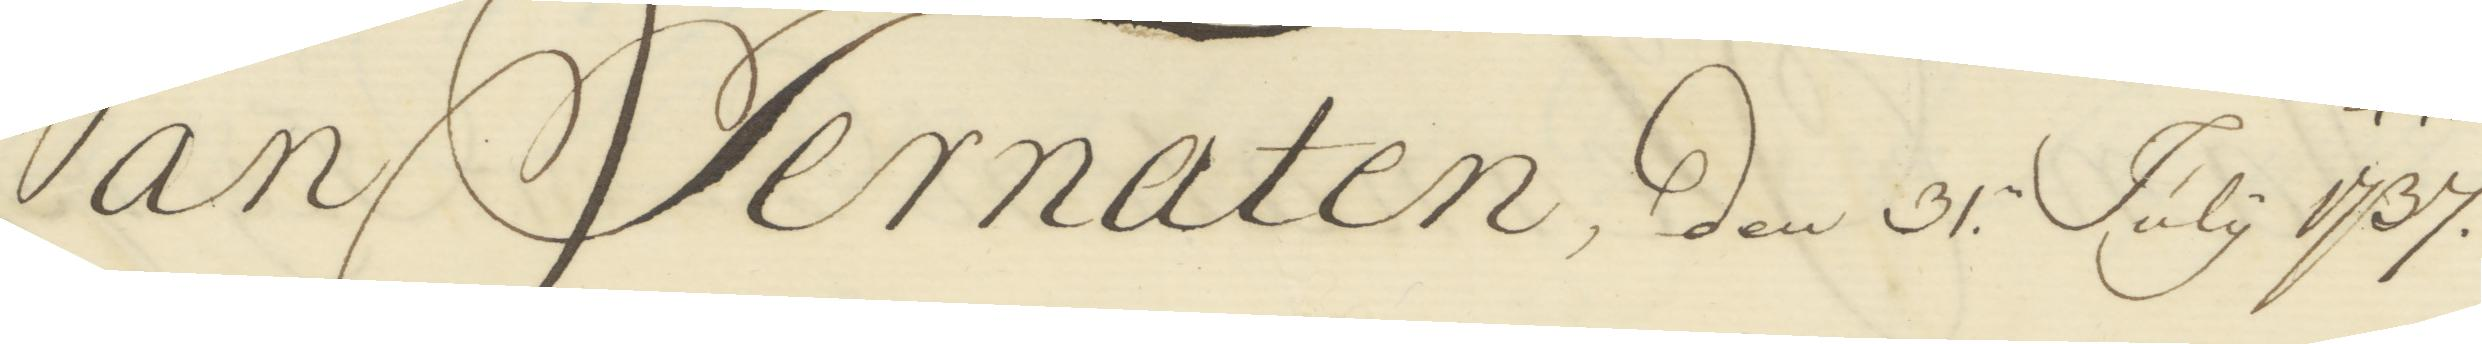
van Ternaten, den 31.' Iulij 1737.
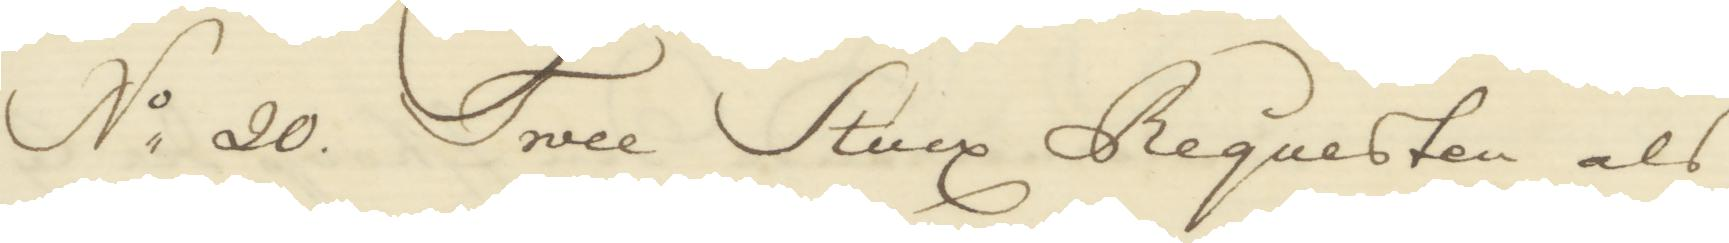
N„o 20. Twee Stucx Requesten als
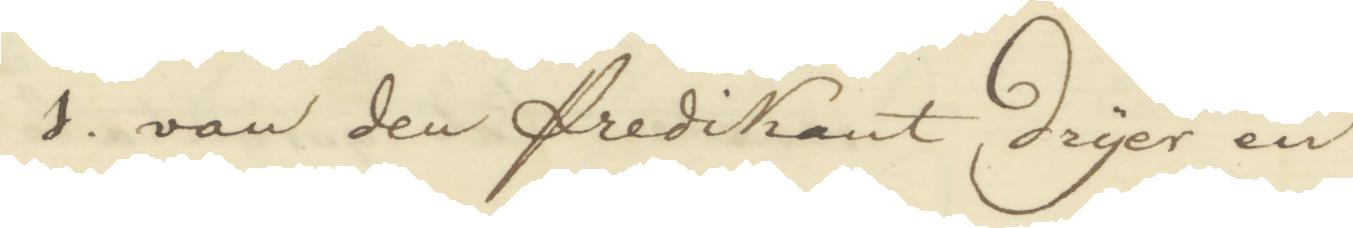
1. van den predikant drijer en
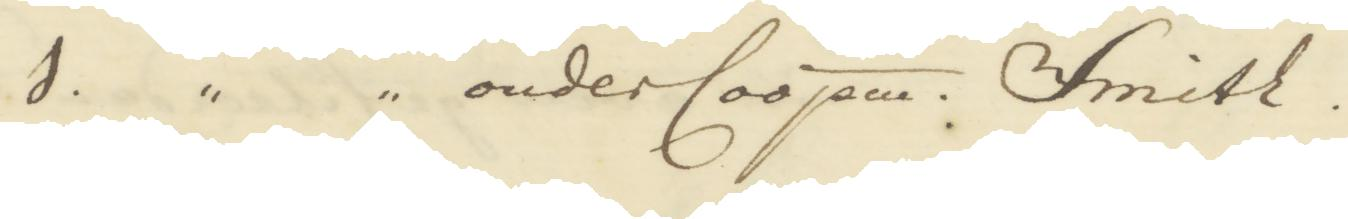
1. „ „ onderCoopen: Smith.
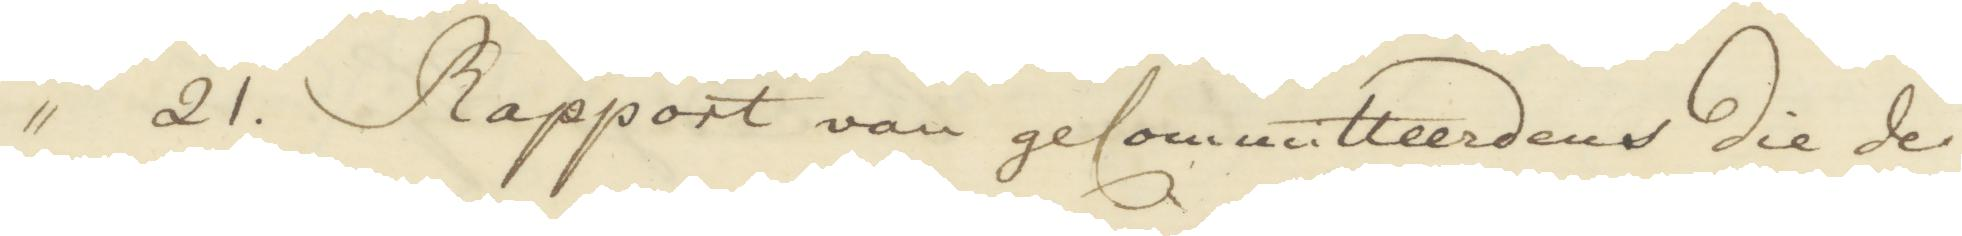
„ 21. Rapport van gecommitteerdens die de
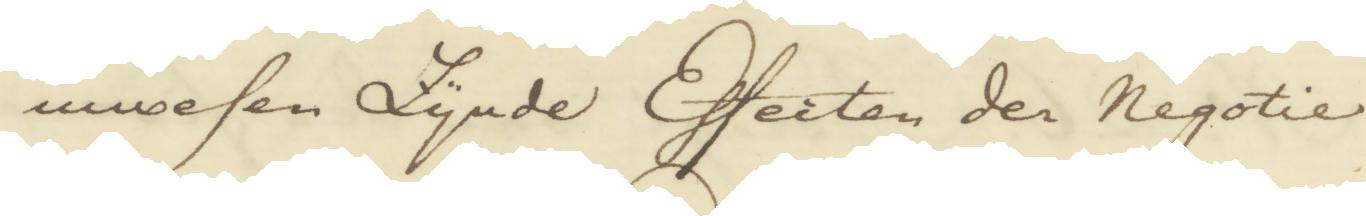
inwesen zijnde Effecten der Negotie
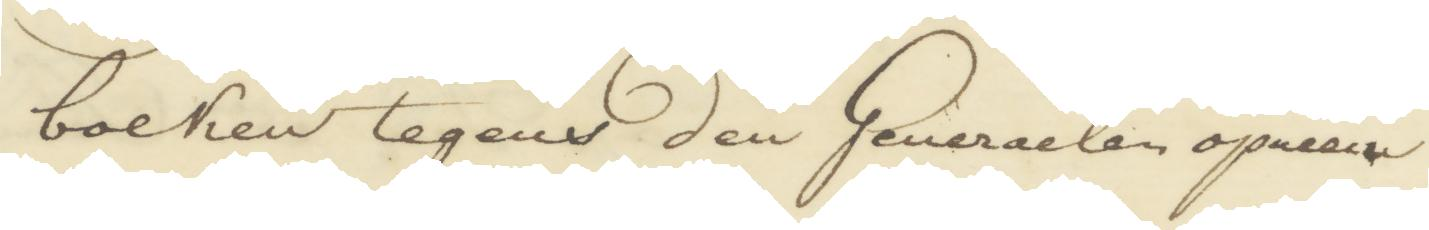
boeken tegens den Generaelen opneem
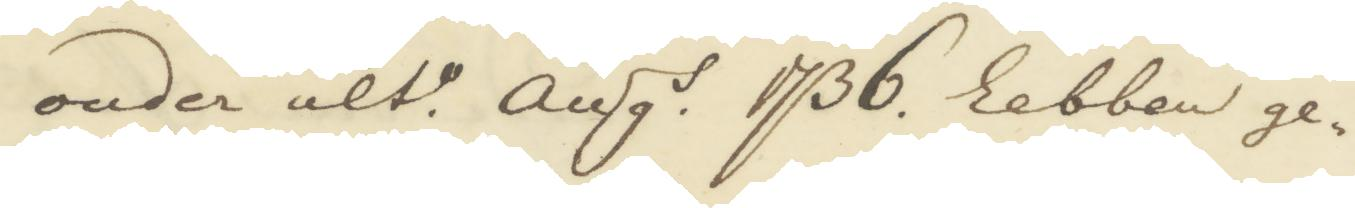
onder ult.o aug.s 1736. hebben ge„
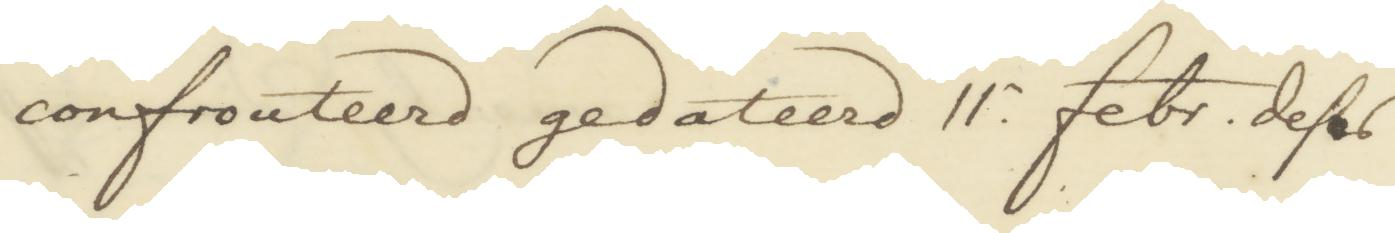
confronteerd gedateerd 11.' febr. deses
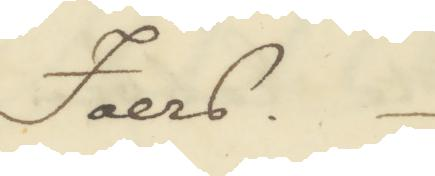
Iaers. —
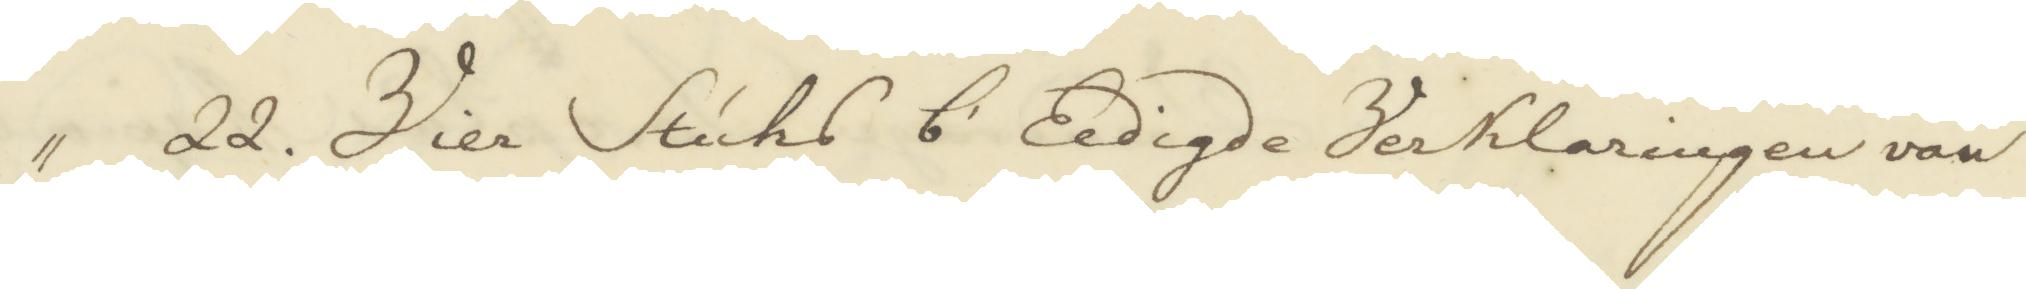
„ 22. Vier Stuks b' Eedigde Verklaringen van
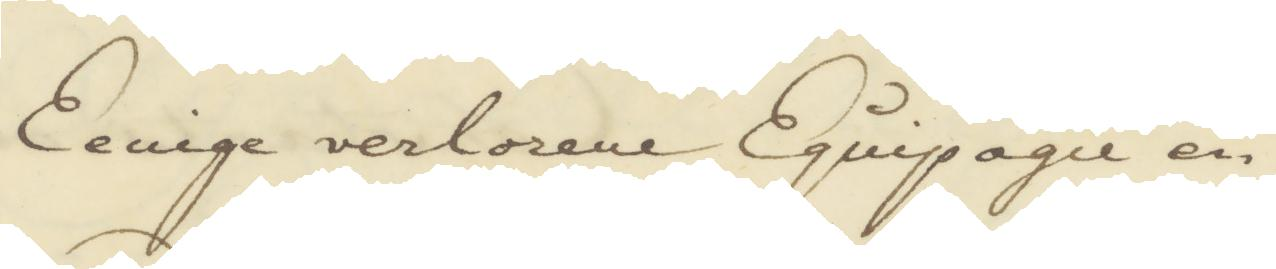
Eenige verlorene Equipagie en
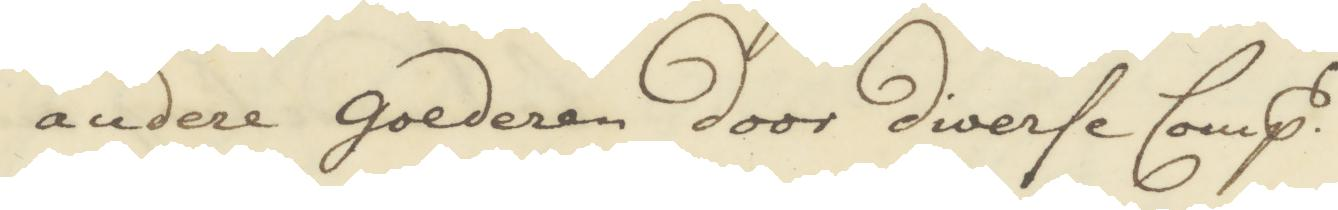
andere goederen door diverse Comp.s
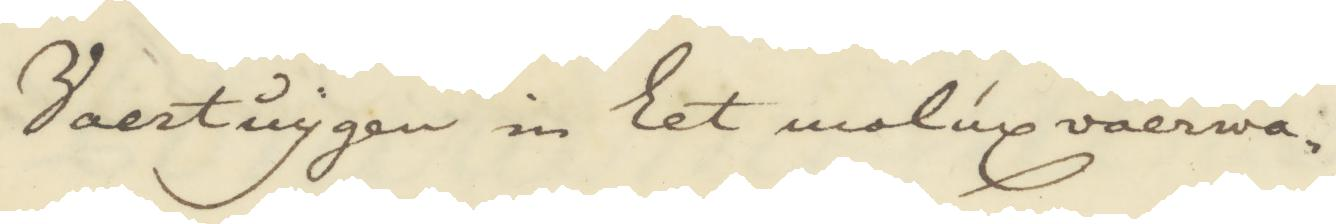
Vaertuijgen in het molux vaerwa„
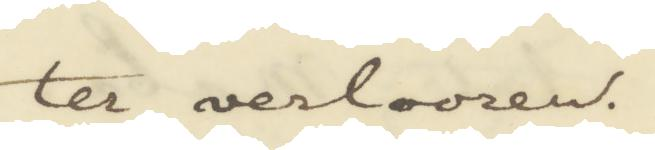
ter verlooren.
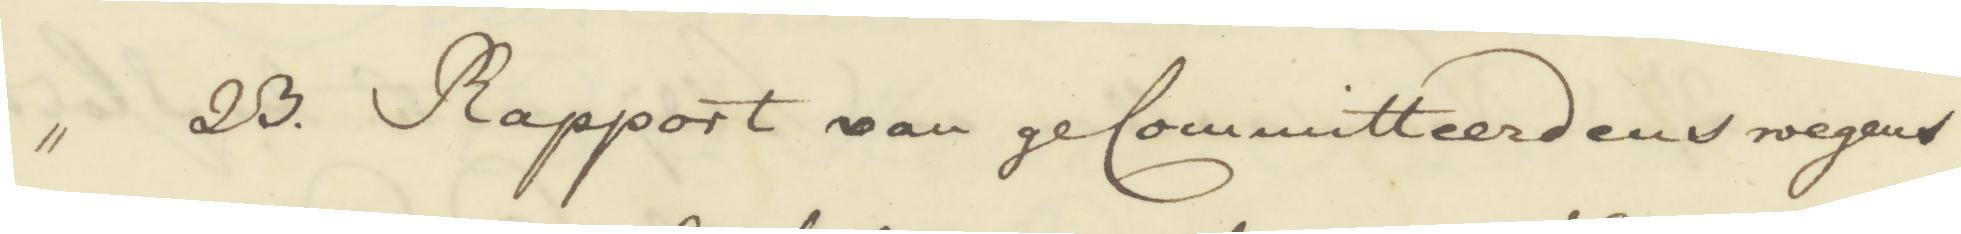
„ 23. Rapport van gecommitteerdens wegens
